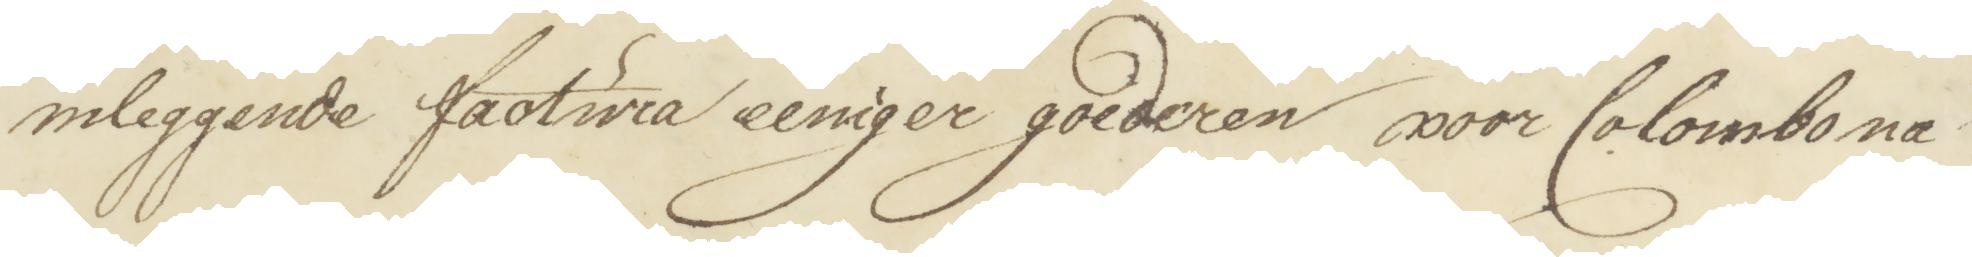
inleggende factura eeniger goederen voor Colombo na
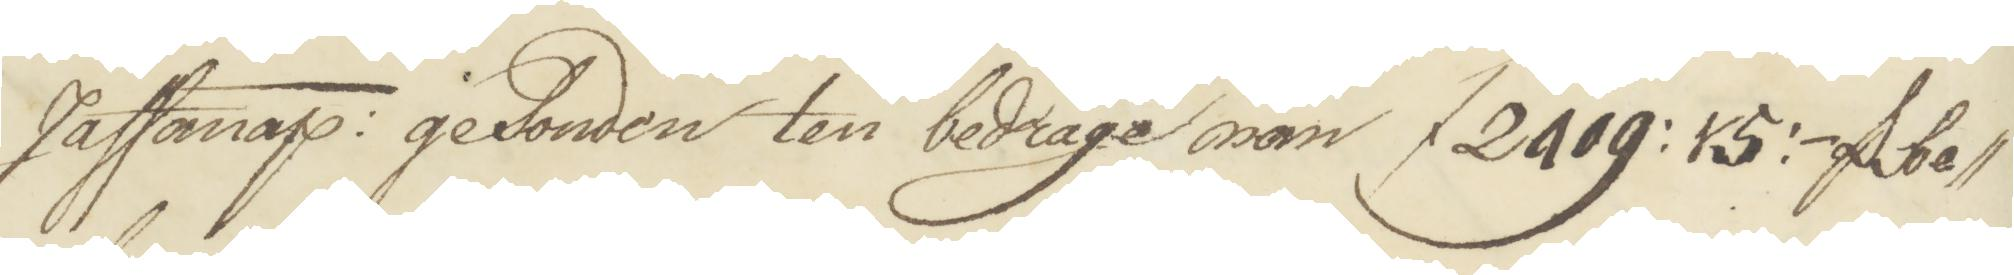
Jaffanap: gesonden ten bedrage van ƒ 2409: 15: — versoe„
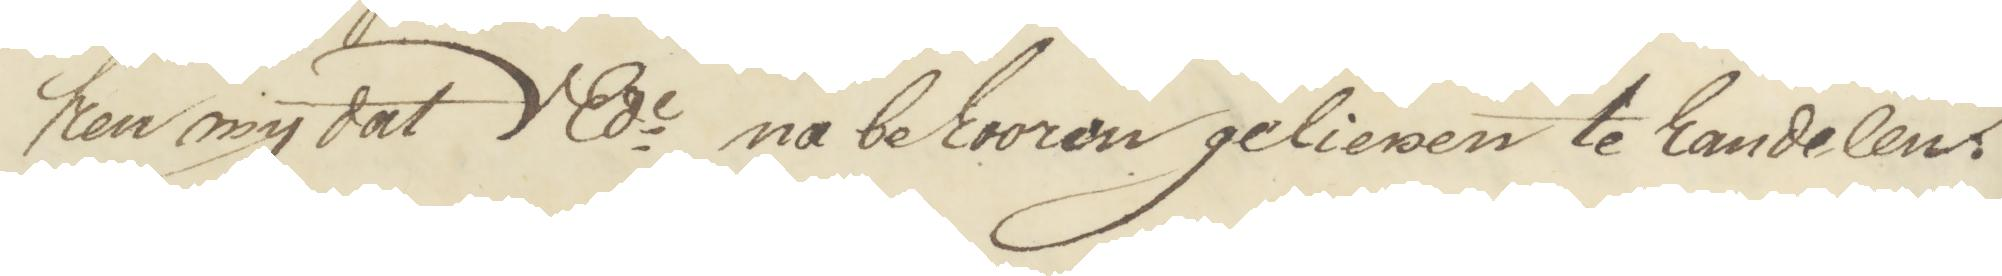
ken wij dat VEd=e na behooren gelieven te handelen:
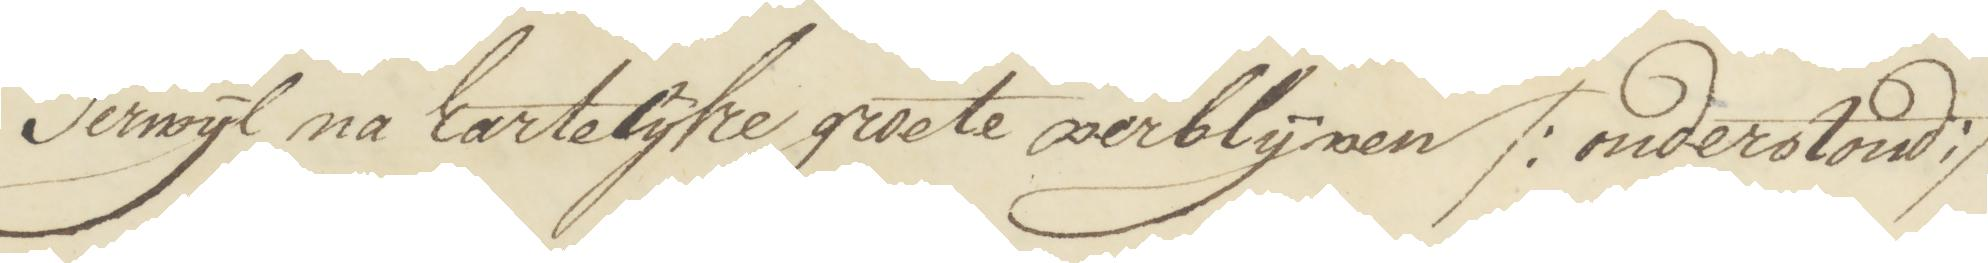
Terwijl na hartelijke groete verblijven /:onderstond:/
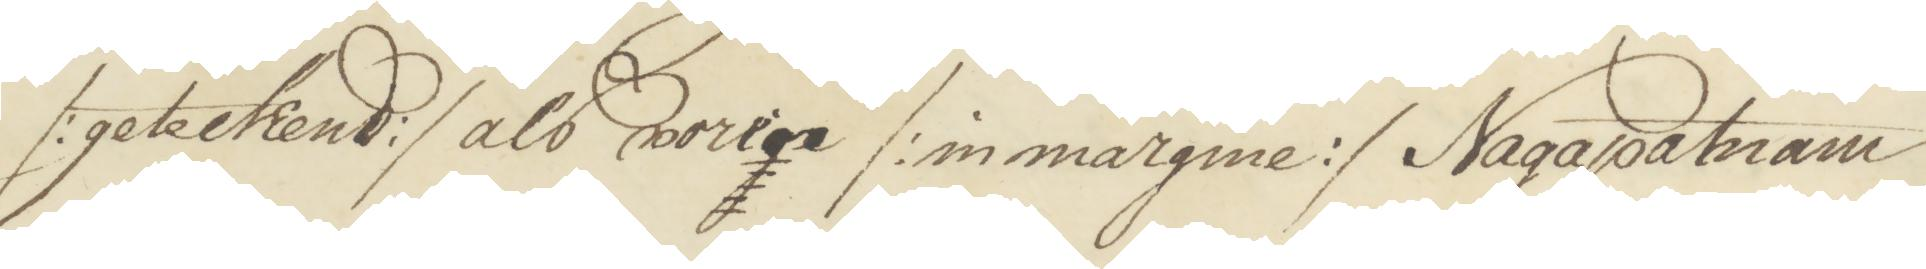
/:geteekend:/ als voregn /:in margine:/ Nagapatnam
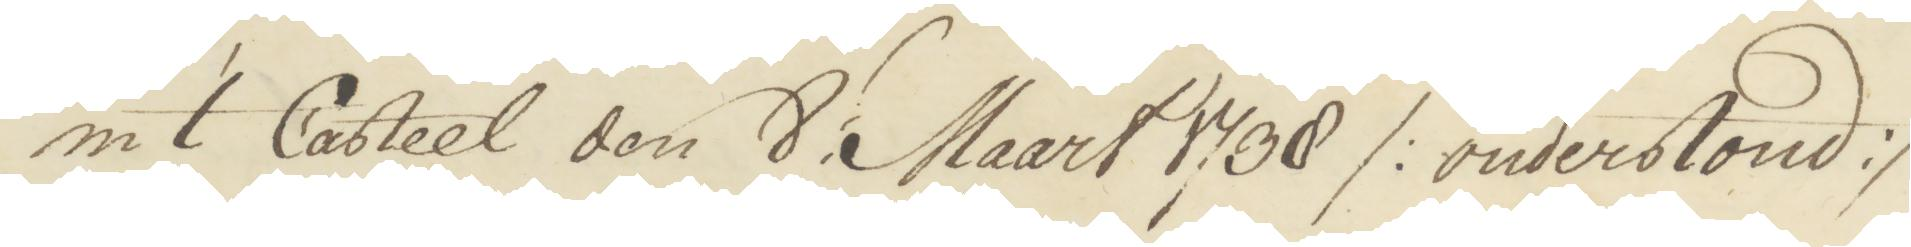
in ’t Casteel den 8:' Maart 1738 /:onderstond:/
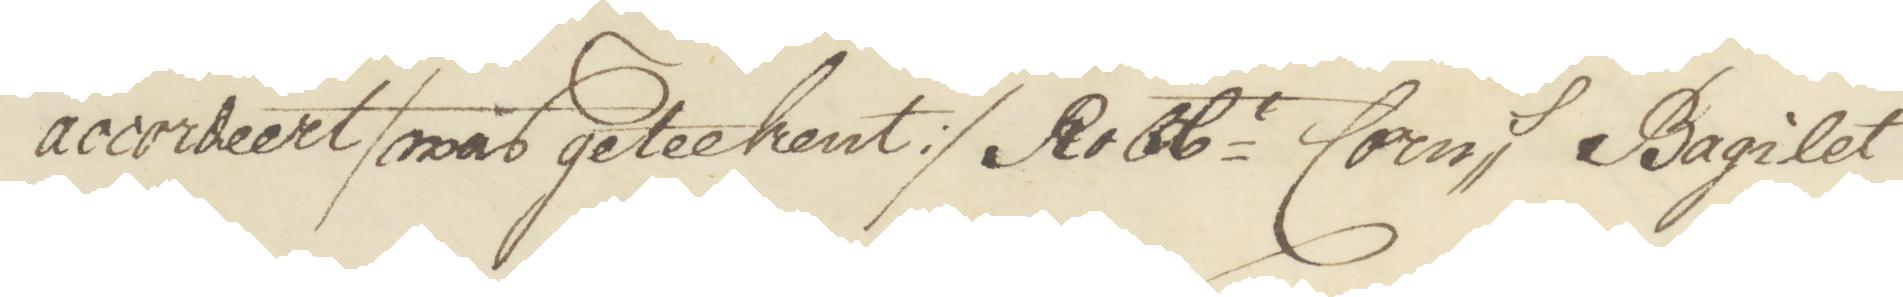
accordeert /was geteekent :/ Robb=t Corn„s Bagilet
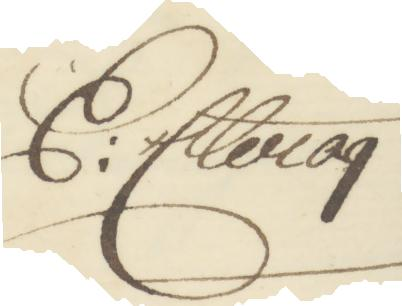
E: Clercq
